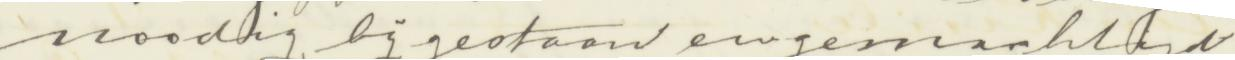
noodig bijgestaan en gemachtgd
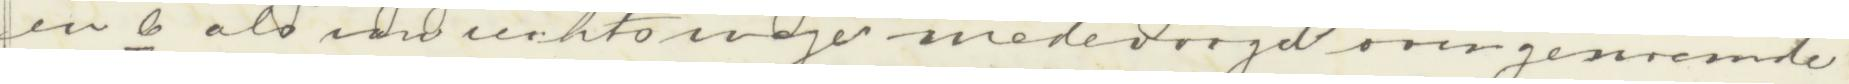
en b als van rechtswege medevoogd over genoemde
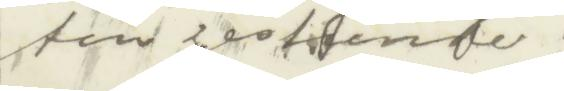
ten zestiende
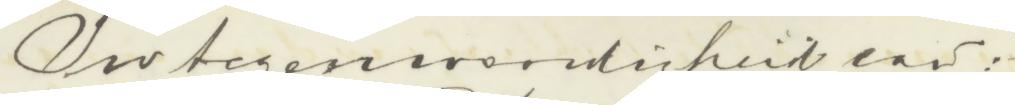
In tegenwoordigheid van:
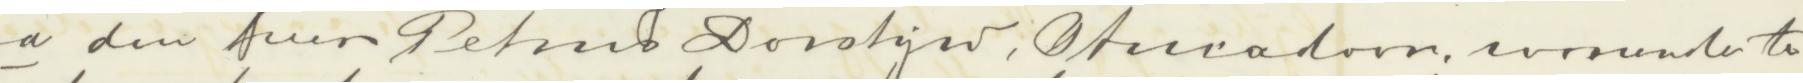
a den heer Petrus Dorstijn, Stucadoor, wonende te
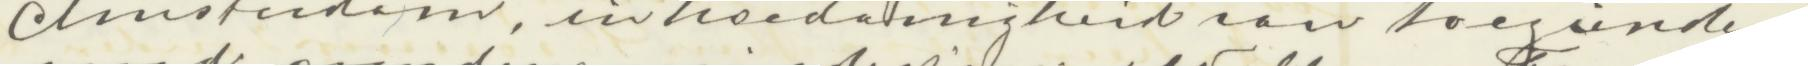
Amsterdam, in hoedanigheid van toezienden
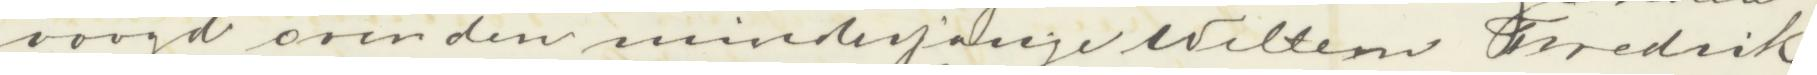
voogd over den minderjarige Willem Fredrik
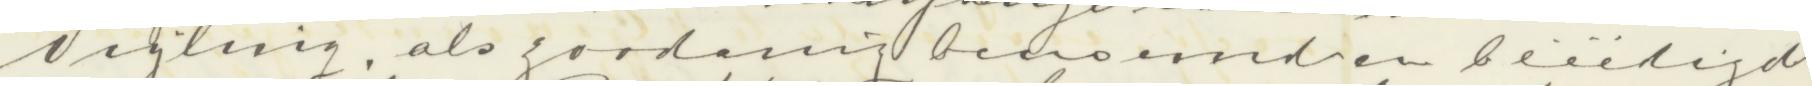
Vrijling als zoodanig benoemd en beëedigd
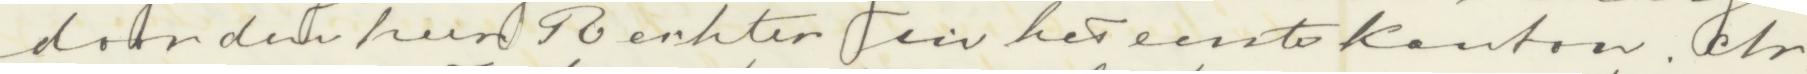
door den heer Rechter in het eerste Kantoor, Ar
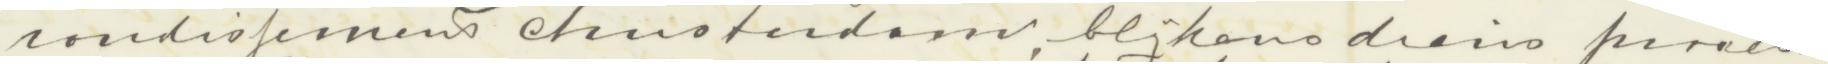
rrondissement Amsterdam, blijkens diens proces
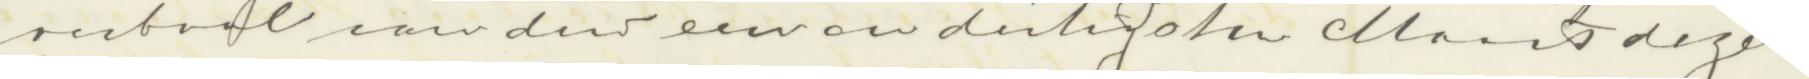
verbaal van den een en dertigsten Maart dezes
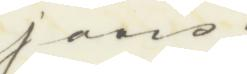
jaars
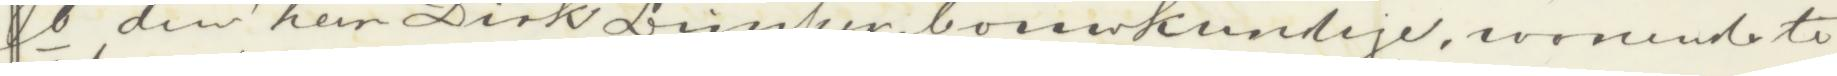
b den heer Dirk Limper, bouwkundige, wonende te
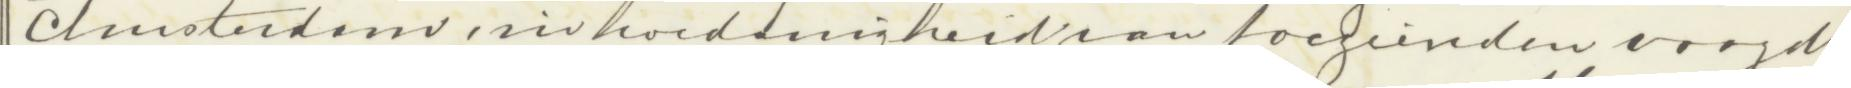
Amsterdam, in hoedanigheid van toezienden voogd
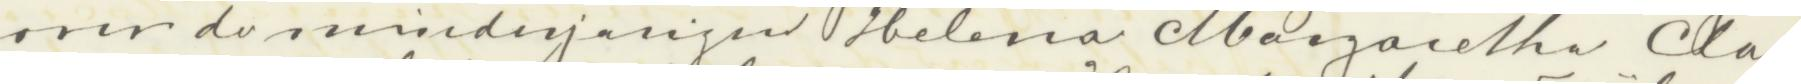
over de minderjarigen Helena Margaretha Cla
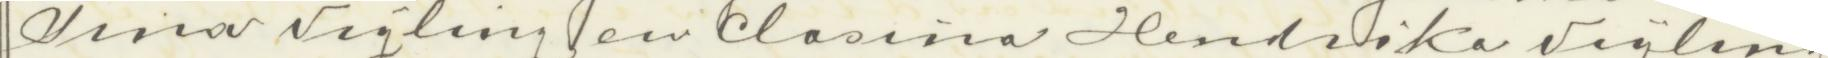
sina Vrijling en Clasina Hendrika Vrijling
